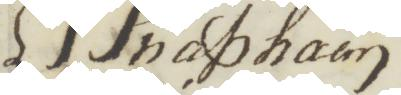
1 Snaphaan
